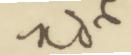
rds
